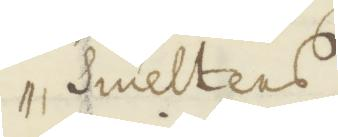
„ , smelters
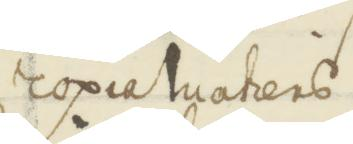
ropiamakers
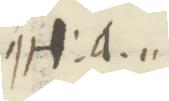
„–1:4.„
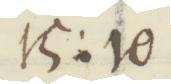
15:10
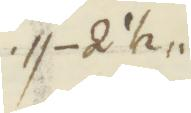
„–2½
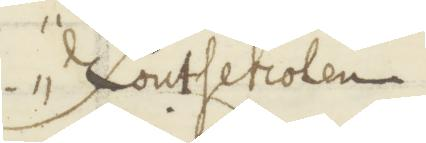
„ houtsekolen
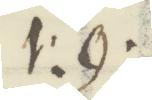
1:9:
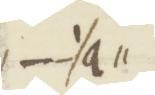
– –4„
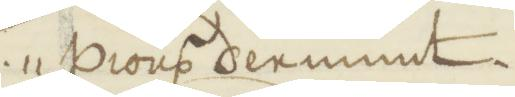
„ pions der munt
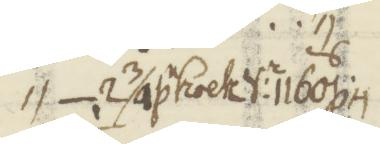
„ — 2¾ pr koek v:r 1160 ps
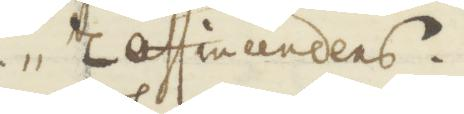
„ raffineerders.
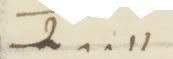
2 . . „
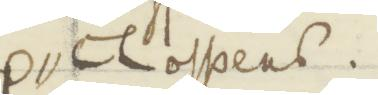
Cloppers .
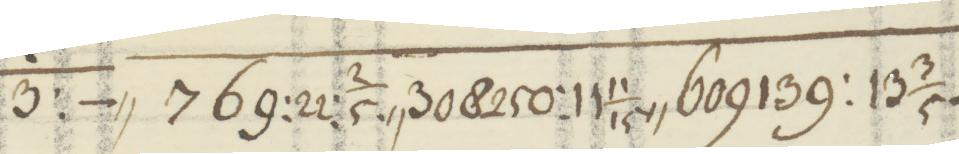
3: –769:22:2/5.„308250:11 11/15 „609139:13 3/5
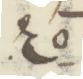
r-o
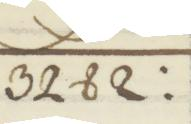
3282:
